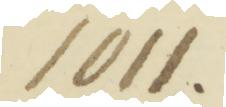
1011.
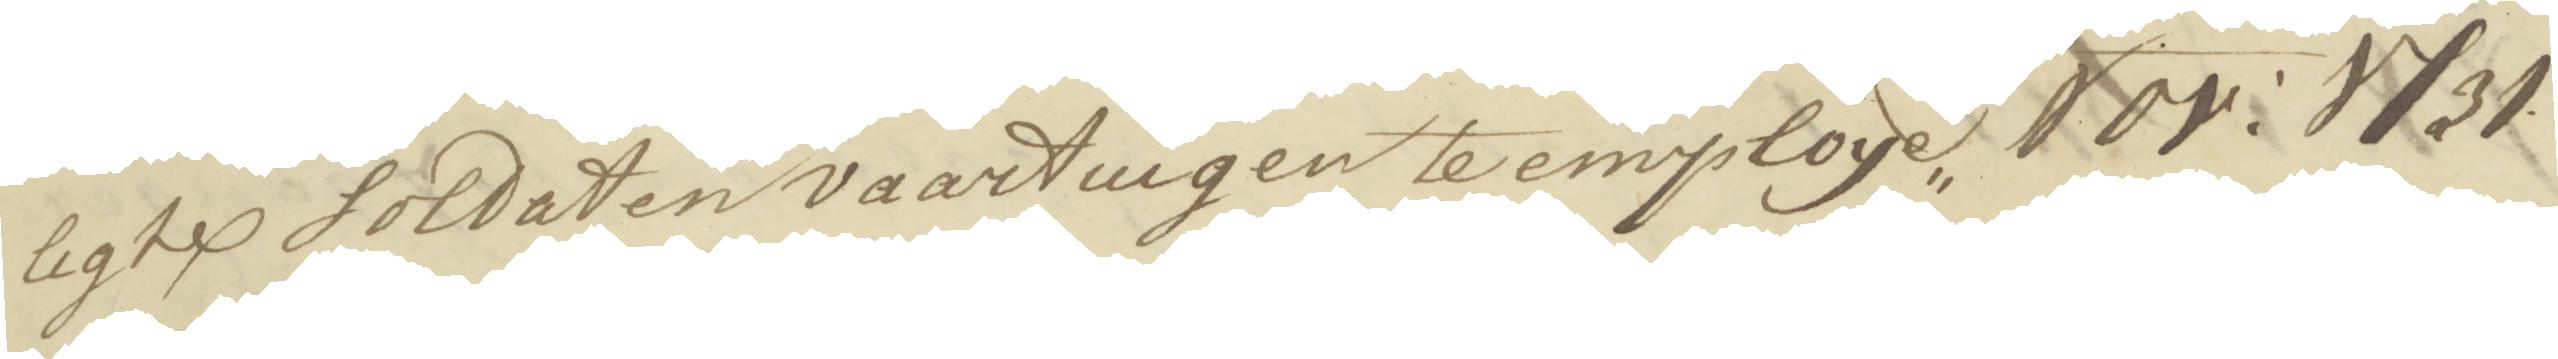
ligte soldaten vaartuigen te emploije„ Nov: 1731.
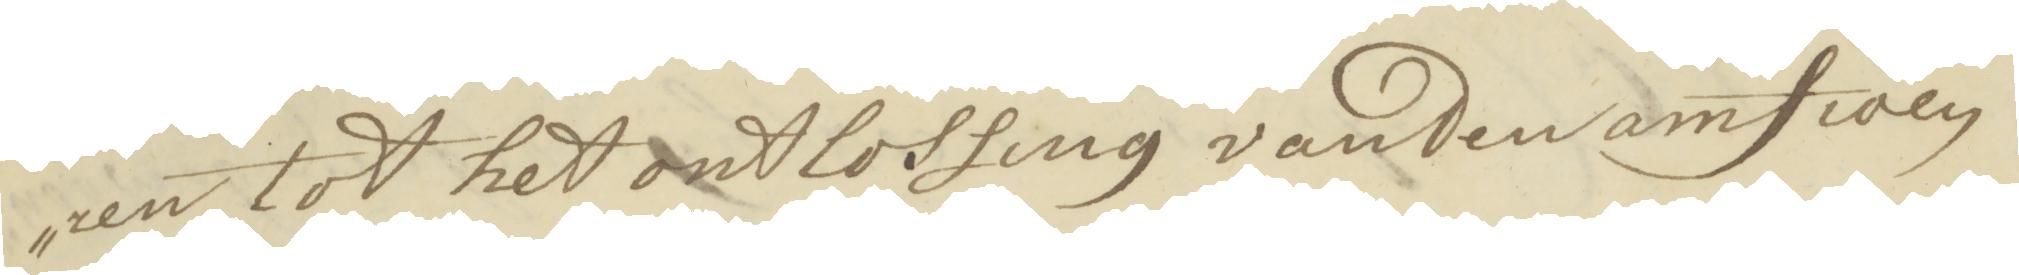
„ren tot het ontlossing van den amfioen
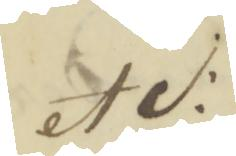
etc:
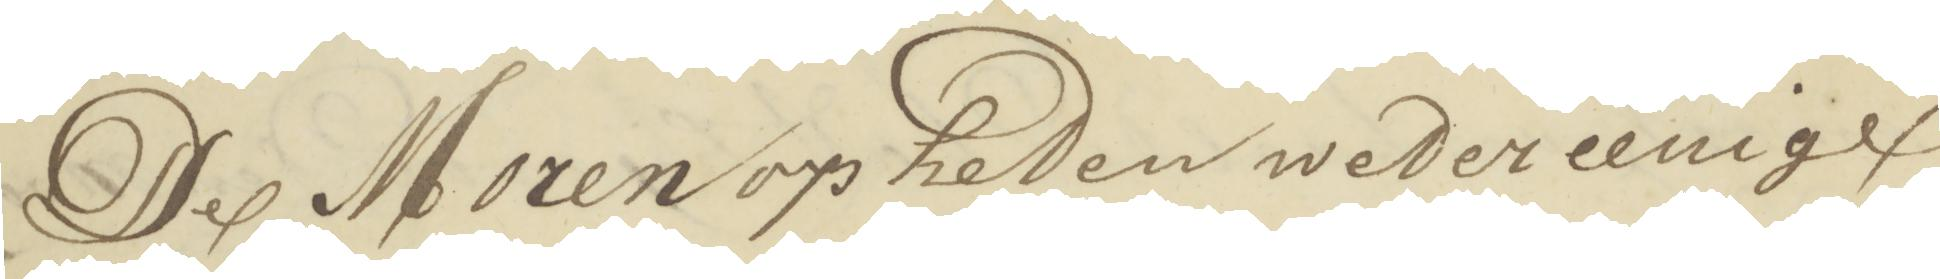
De Moren op heden weder eenige
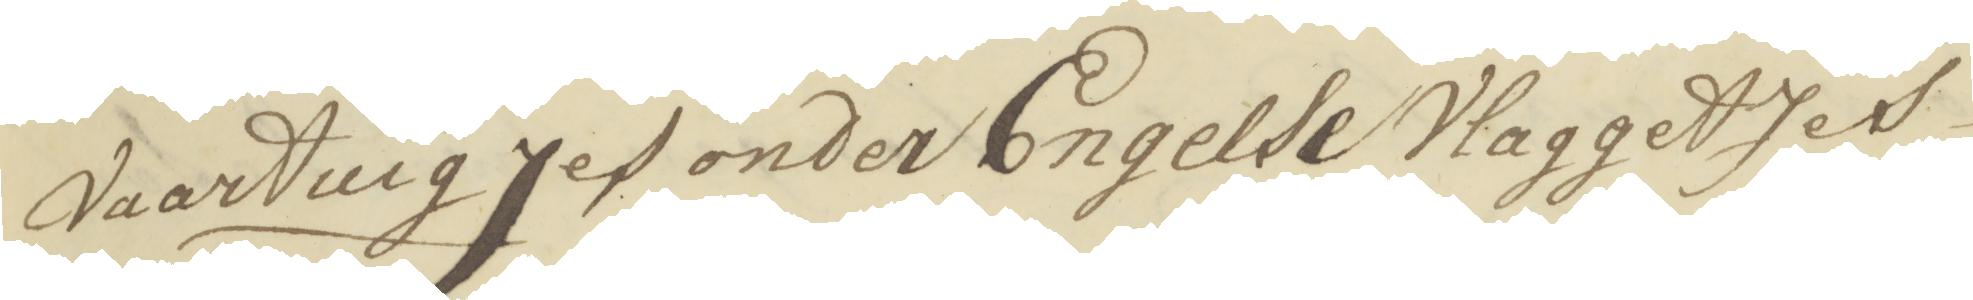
Vaartuigjes onder Engelse Vlaggetjes
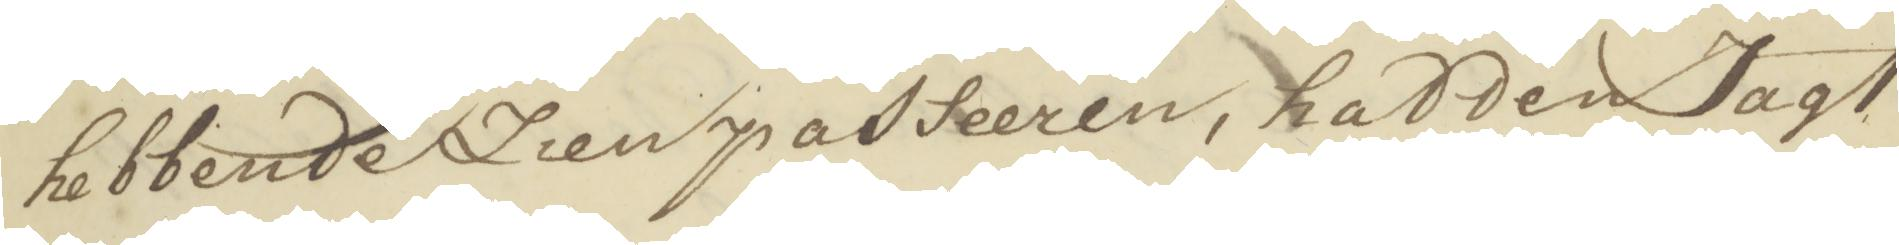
hebbende Zien passeeren, hadden Jagt
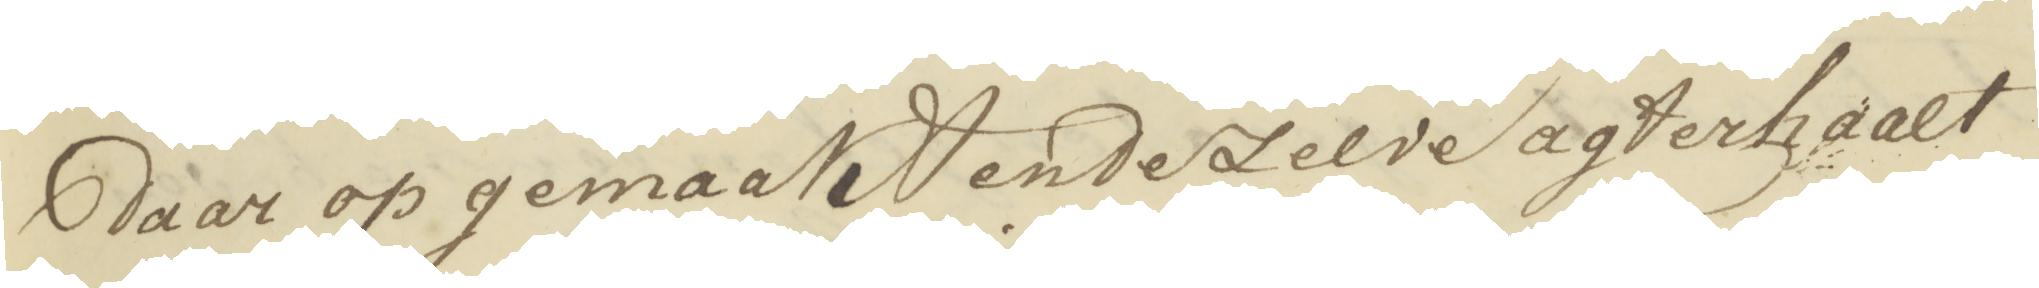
daar op gemaakt en dezelve agterhaalt
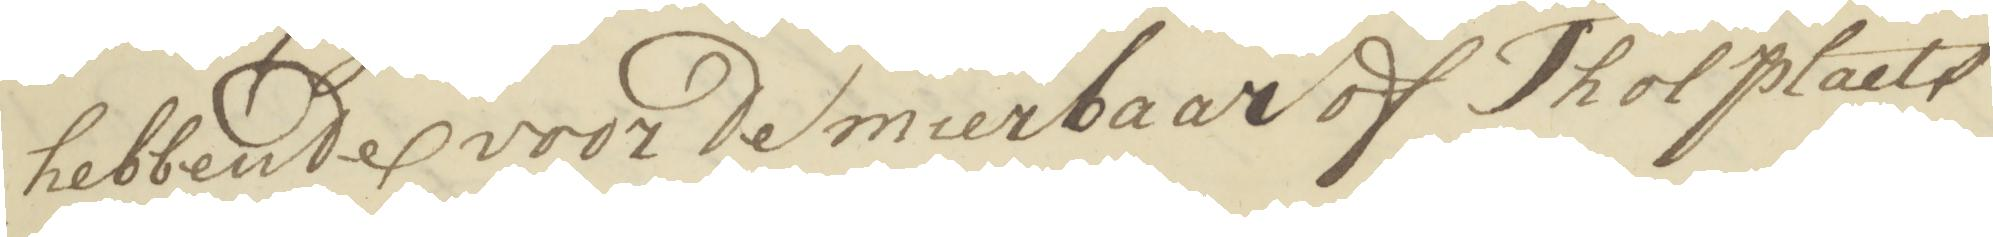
hebben de voor de mierbaar of Tholplaets
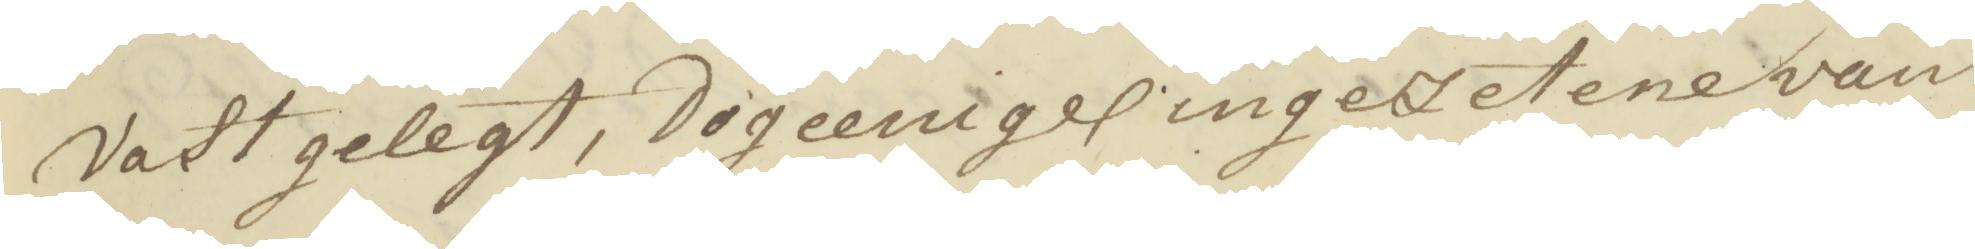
vast gelegt, dog eenige ingezetene van
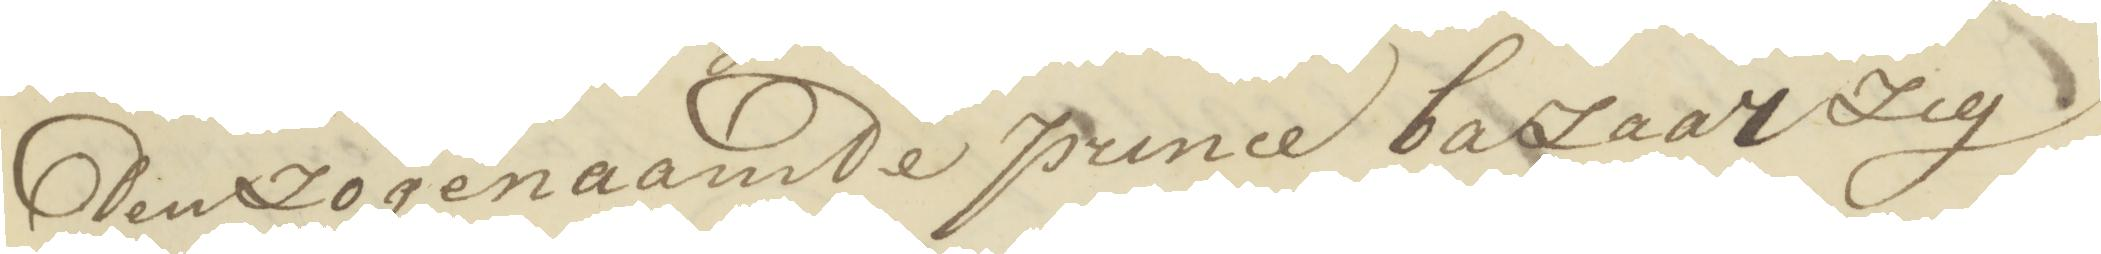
den zo genaamde prince bazaar zig
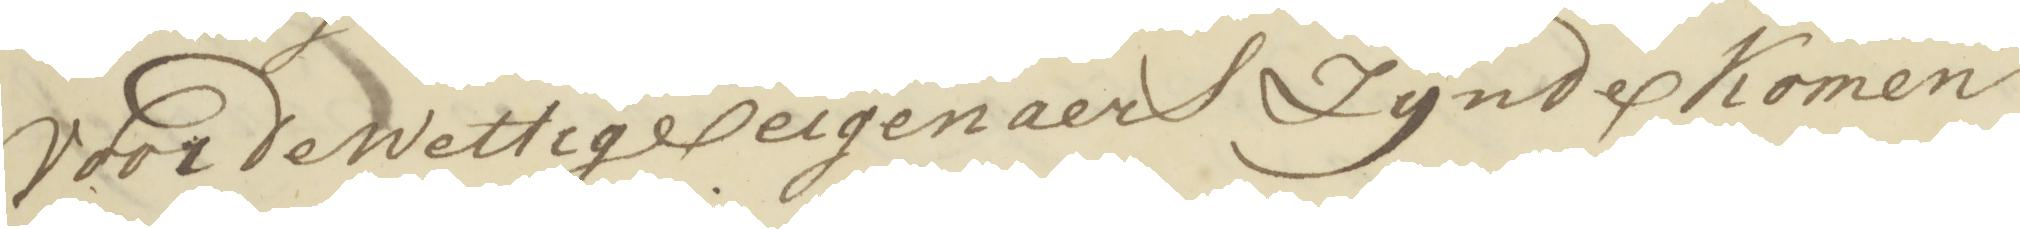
voor de wettige eigenaers Zijnde Komen
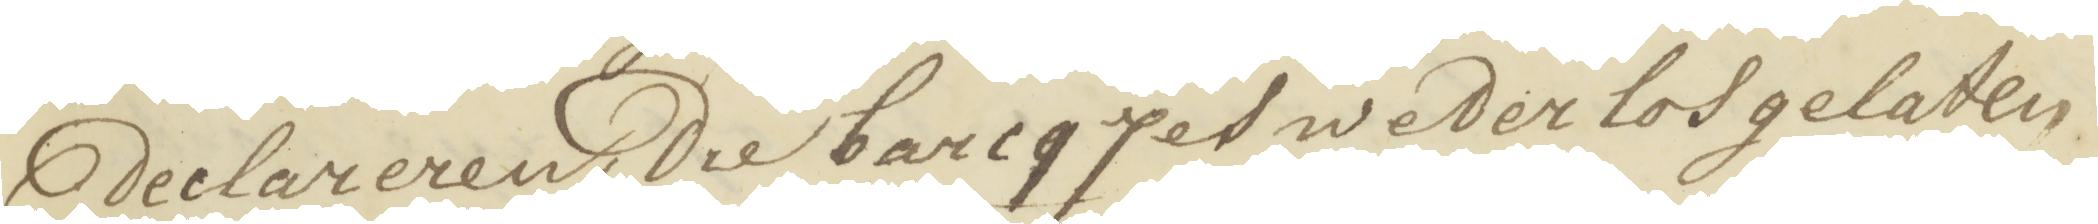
declareren die barcqjes weder los gelaten
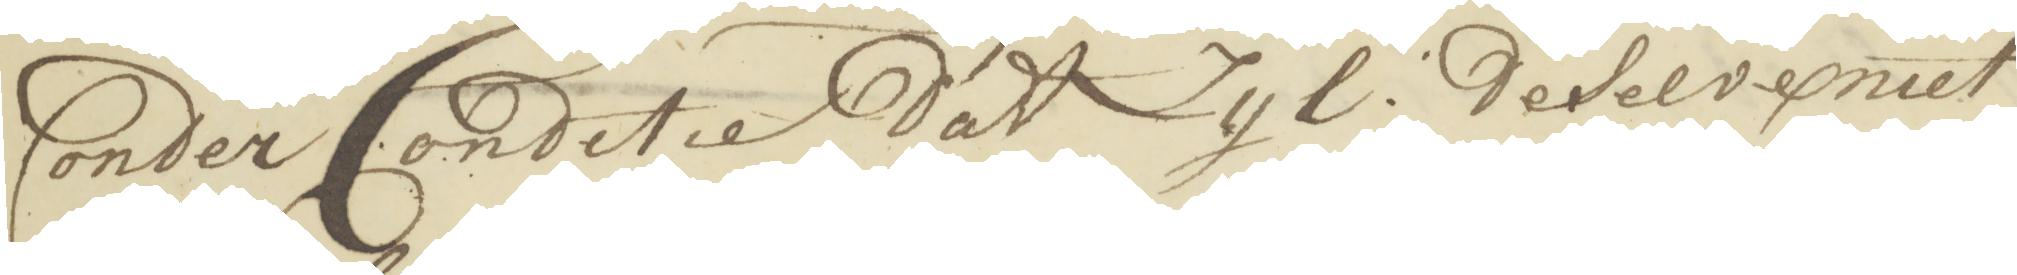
onder Conditie dat Zijl: deselve niet
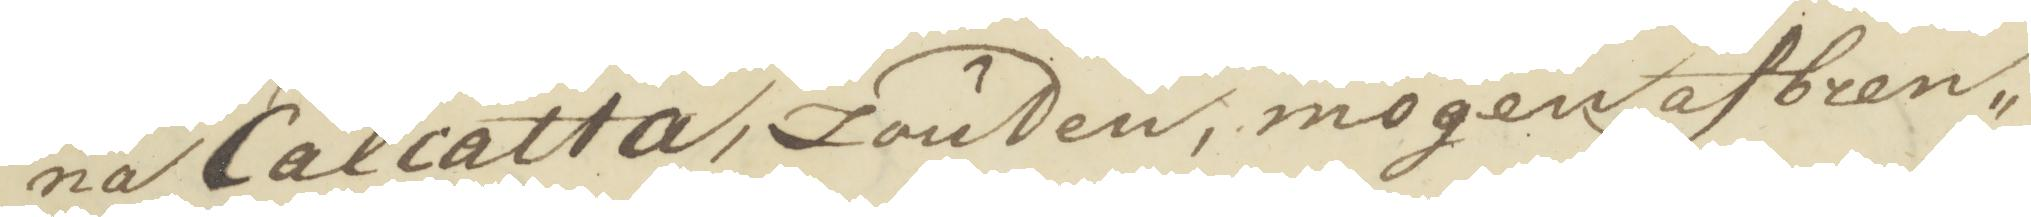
na Calcatta, zouden, mogen afbren„
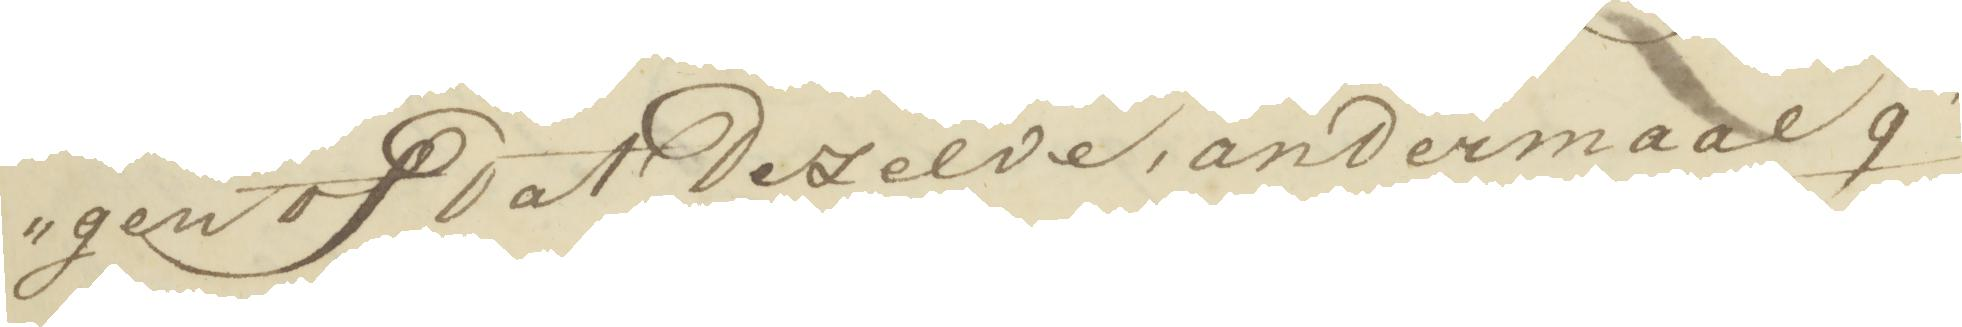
„gen of dat dezelve, andermaal g'
